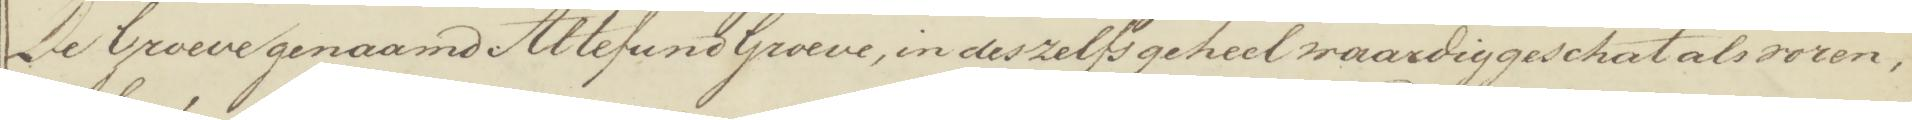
De Groeve genaamd Altefund Groeve, in deszelfs geheel waardig geschat als voren,
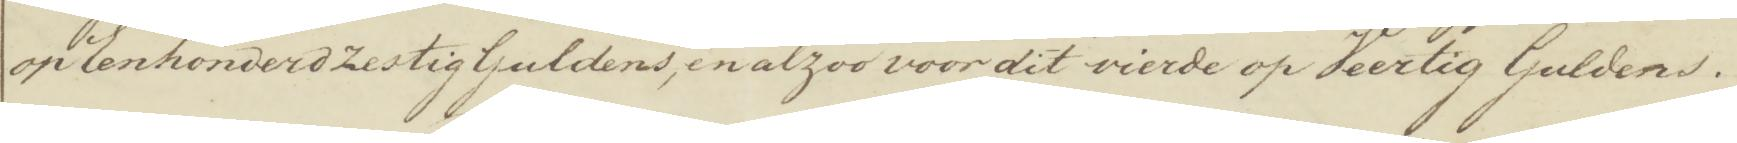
op Een honderd zestig Guldens, en alzoo voor dit vierde op Veertig Guldens.
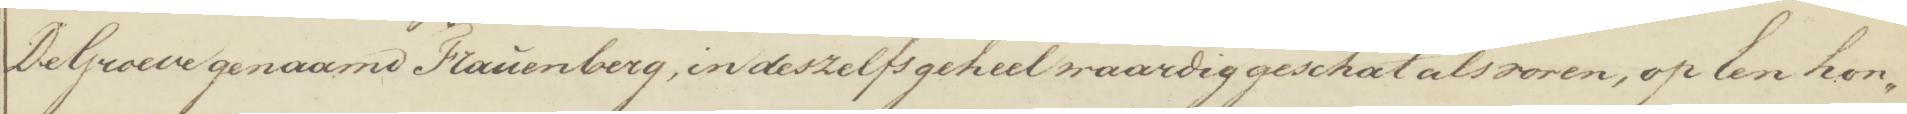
De Groeve genaamd Frauenberg, in deszelfs geheel waardig geschat als voren, op Een hon„
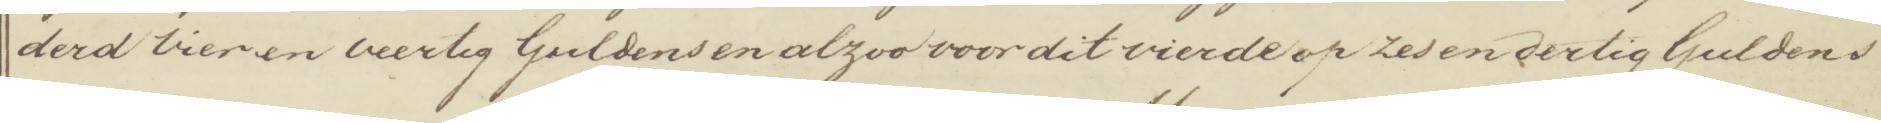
derd vier en veertig Guldens en alzoo voor dit vierde op zes en dertig Guldens
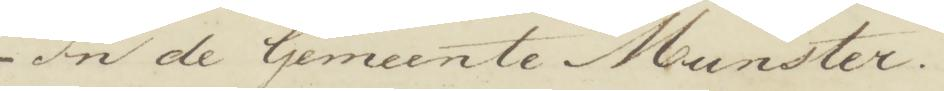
In de Gemeente Munster.
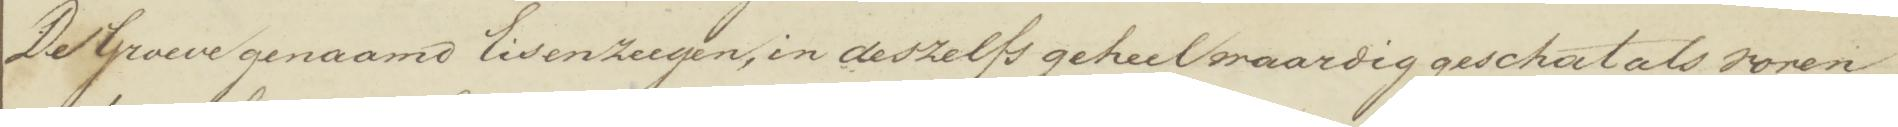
De Groeve genaamd Eisenzeegen, in deszelfs geheel waardig geschat als voren
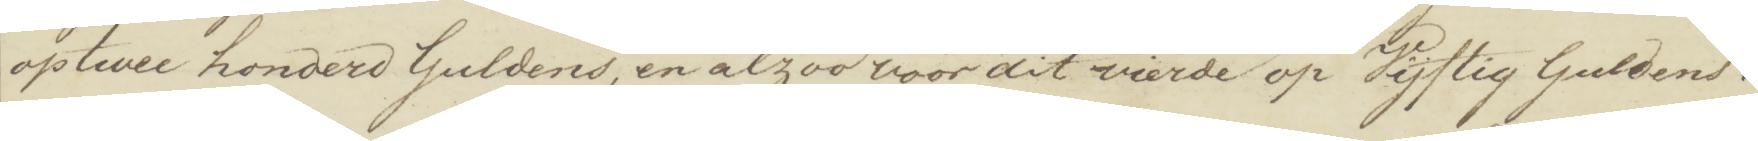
op twee honderd Guldens, en alzoo voor dit vierde op Vijftig Guldens.
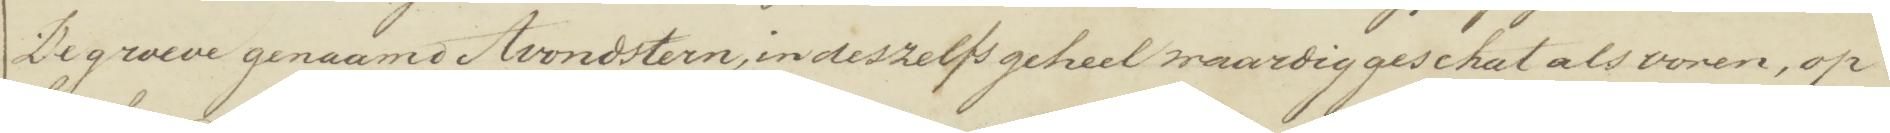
De groeve genaamd Avondstern, in deszelfs geheel waardig geschat als voren, op
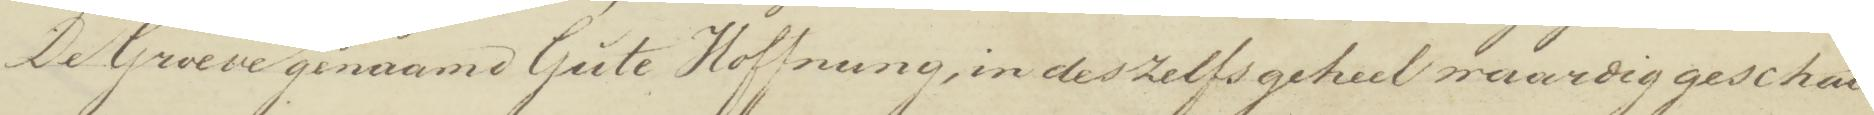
De Groeve genaamd Gute Hoffnung, in deszelfs geheel waardig geschat
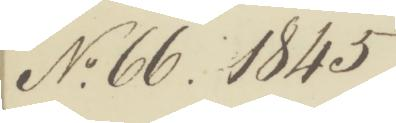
N:o 66. 1845
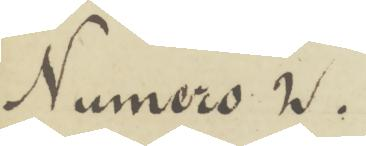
Numero 2.
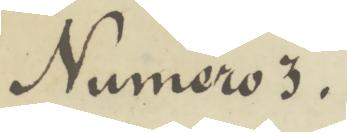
Numero 3.
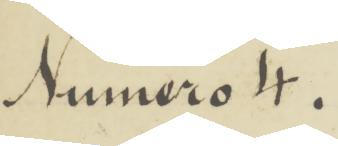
Numero 4.
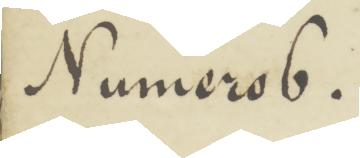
Numero 6.
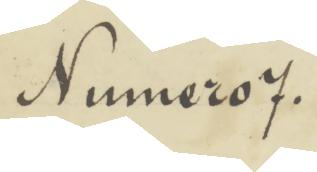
Numero 7.
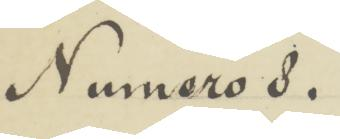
Numero 8.
